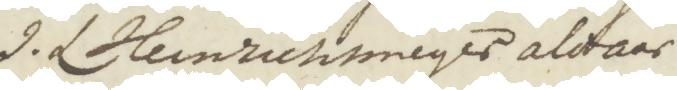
J.L Heinrichtsmeyer aldaar
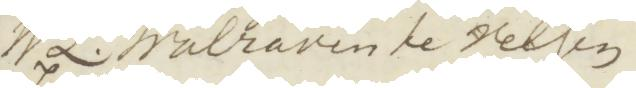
WL Walhaven te Velsen
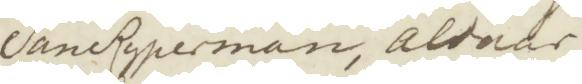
Jan Ryperman, aldaar
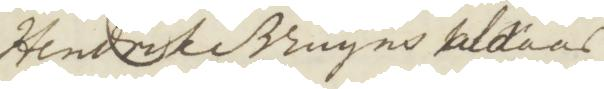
Hendrik Bruyns aldaar
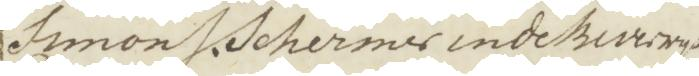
Simons Schermer in de Beverwyk
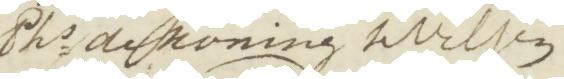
Ph=s de koning te Velsen
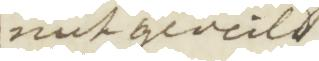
niet geveild
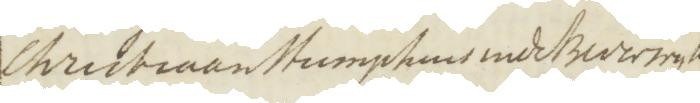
Christiaan Stumphius in de Beverwyk
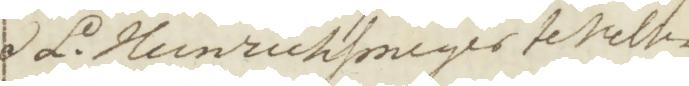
I. L. Heinrichsmeyer te Velsen
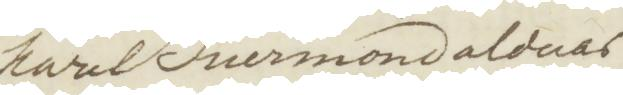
Karel Suermond aldaar
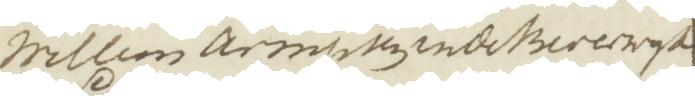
Willem Armpten in de Beverwyk
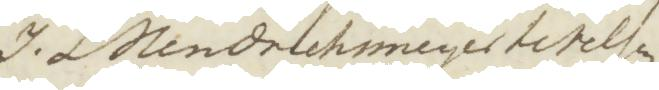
J. L Hendrichsmeyer te Velsen
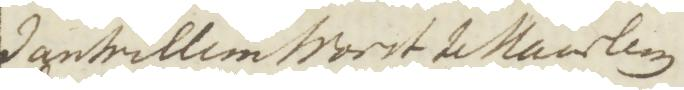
Ian Willem Worst te Haarlem
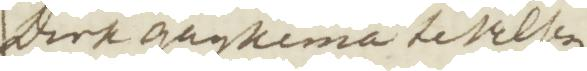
Dirk guykema te Velsen
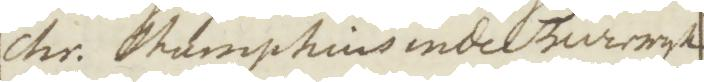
chr. Stumphius in de Beverwyk
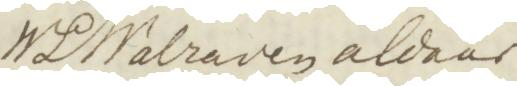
WL Walraven aldaar
